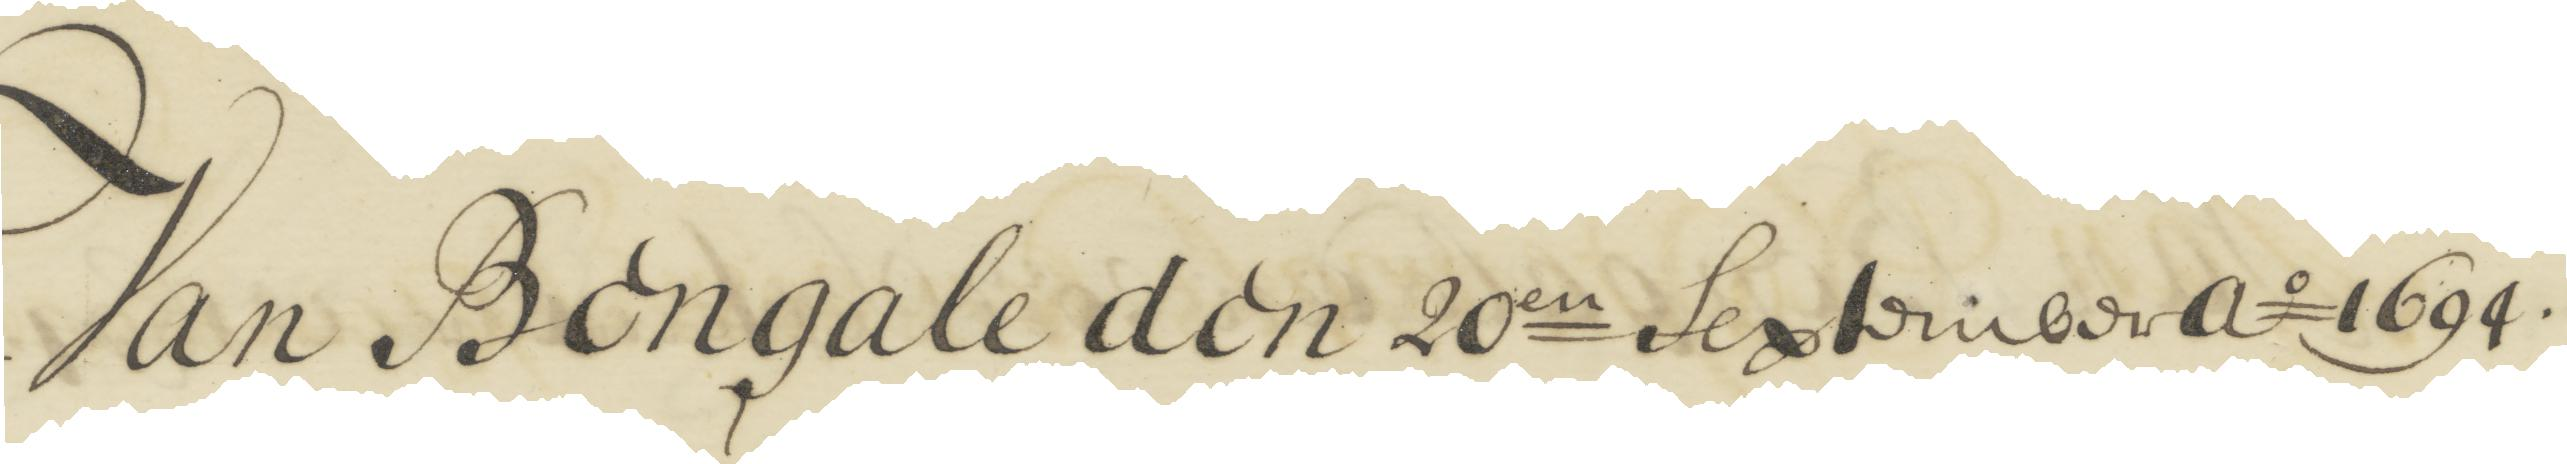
Van Bengale den 20=en September a:o 1694.
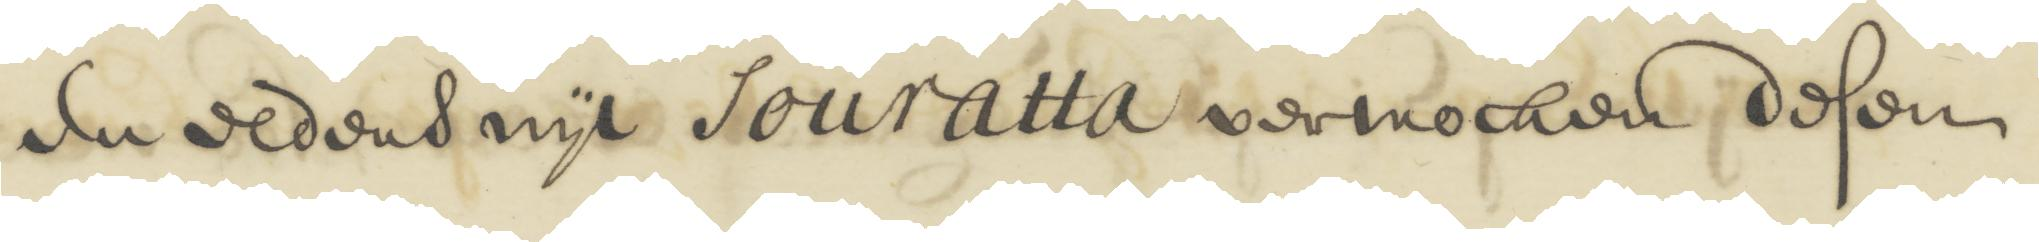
en elders uijt souratta vertrocken desen
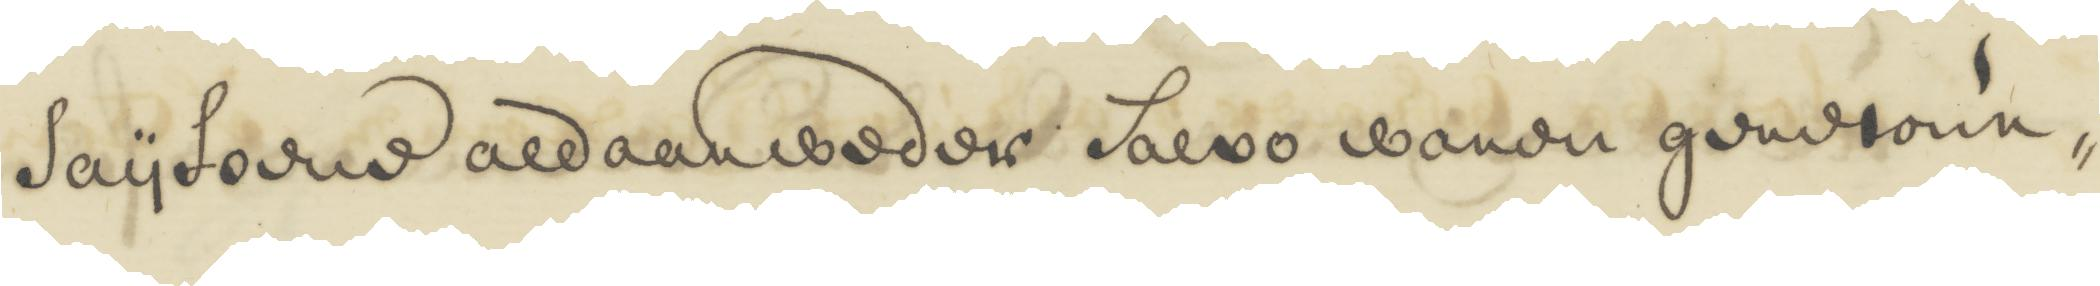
saijsoene aldaar weder salvo waren geretour„
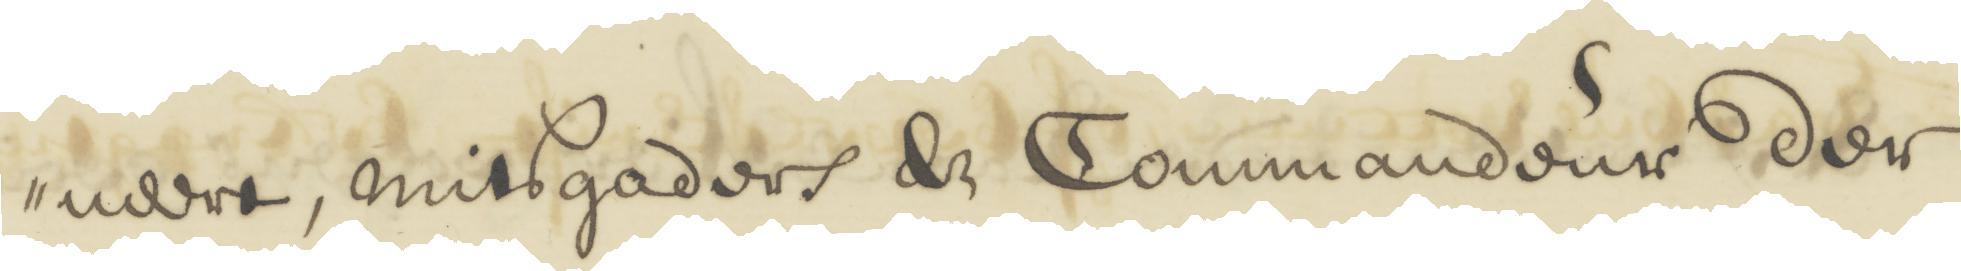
„neert, mitsgaders den Commandeur der
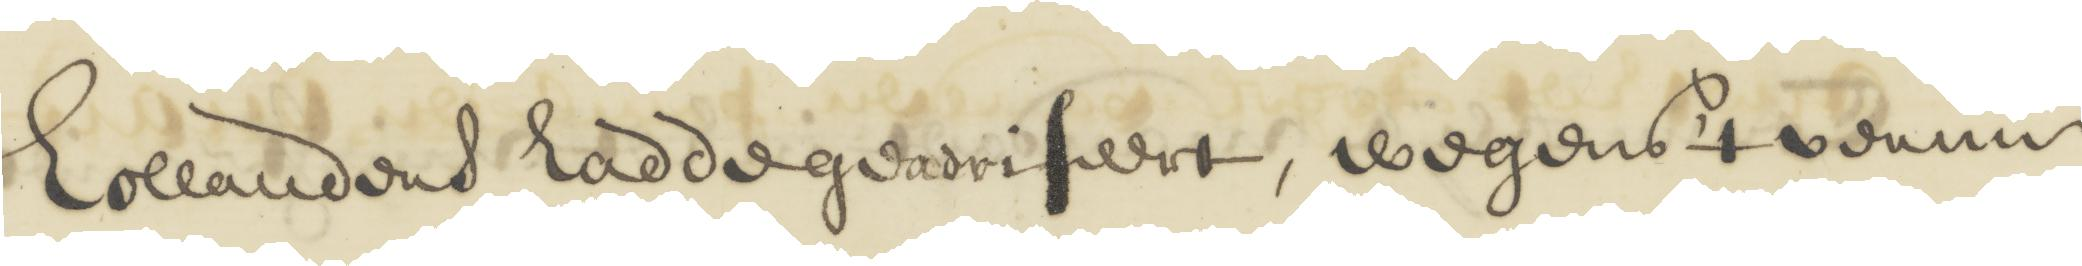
hollanders hadde geadviseert, wegens 't vernie
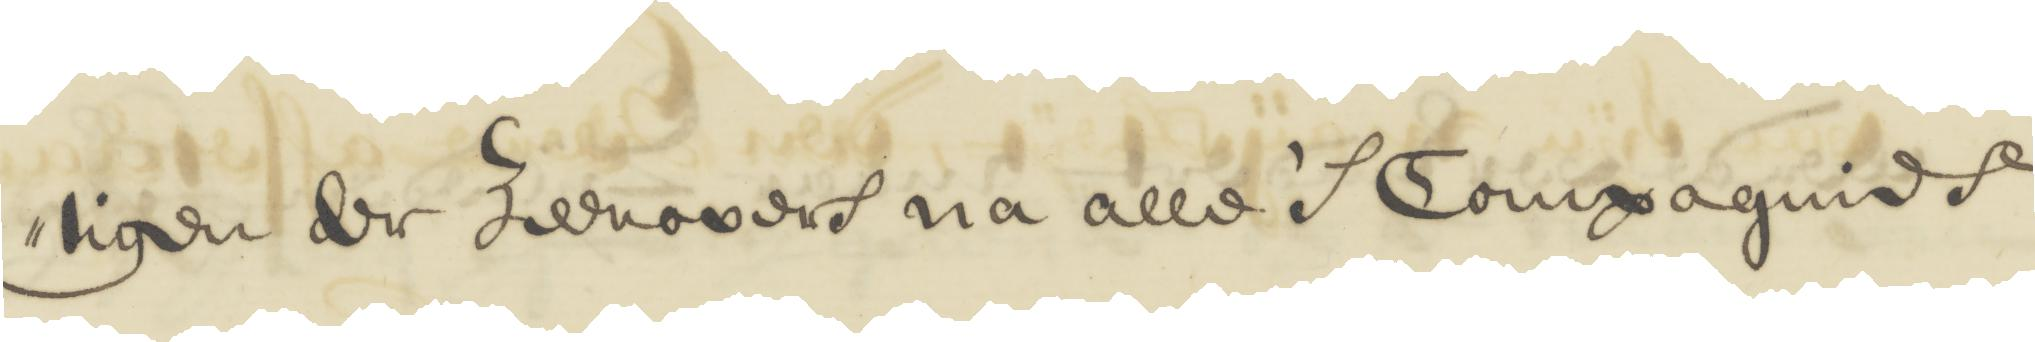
„tigen der zeerovers na alle ’S Compagnies
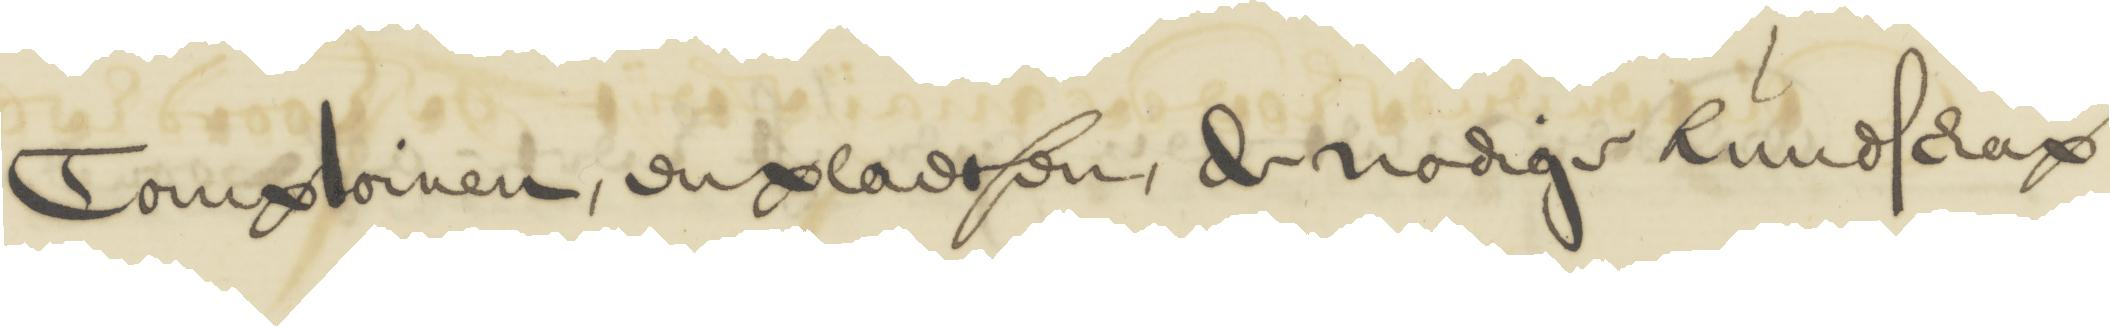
Comptoiren, en plaetsen, de nodige kundschap
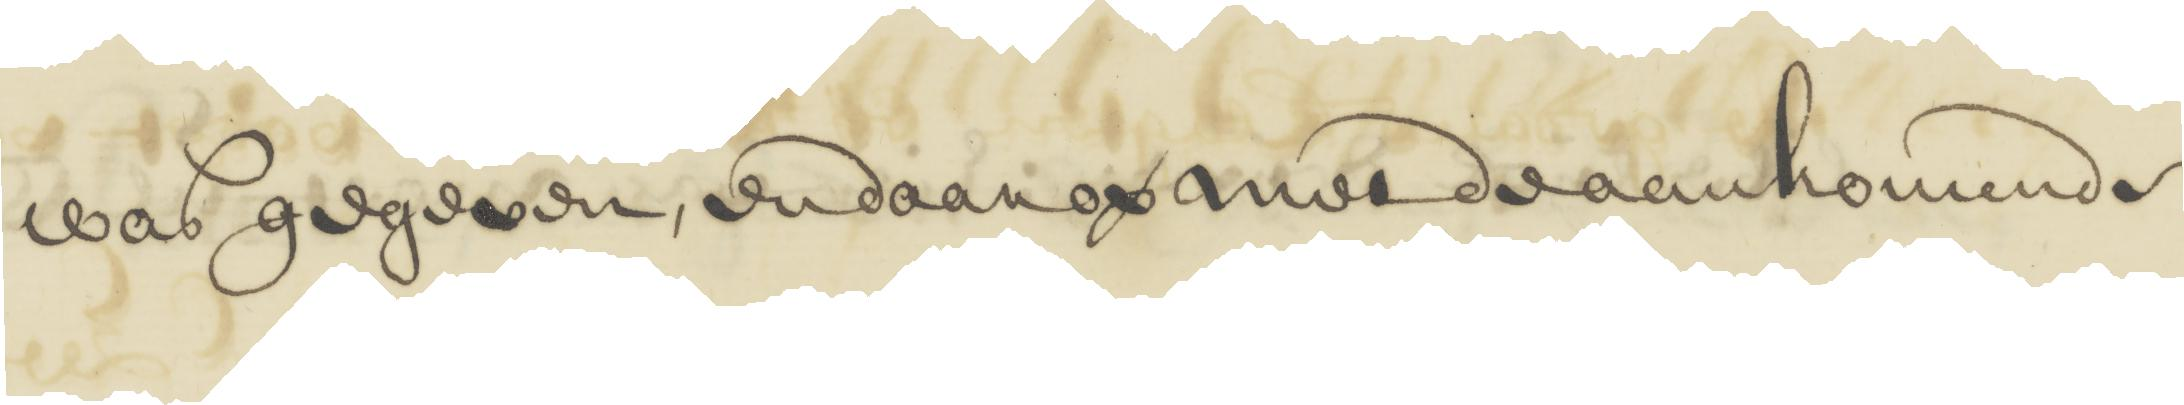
was gegeven, en daar op met de aankomende
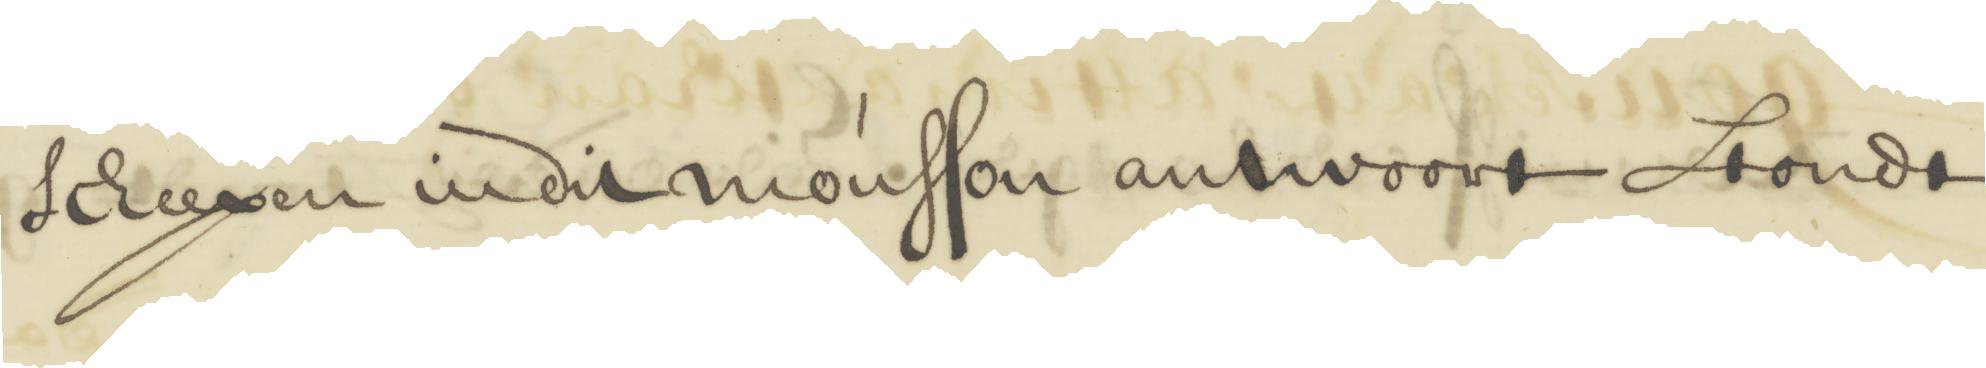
scheepen in dit mousson antwoort stondt
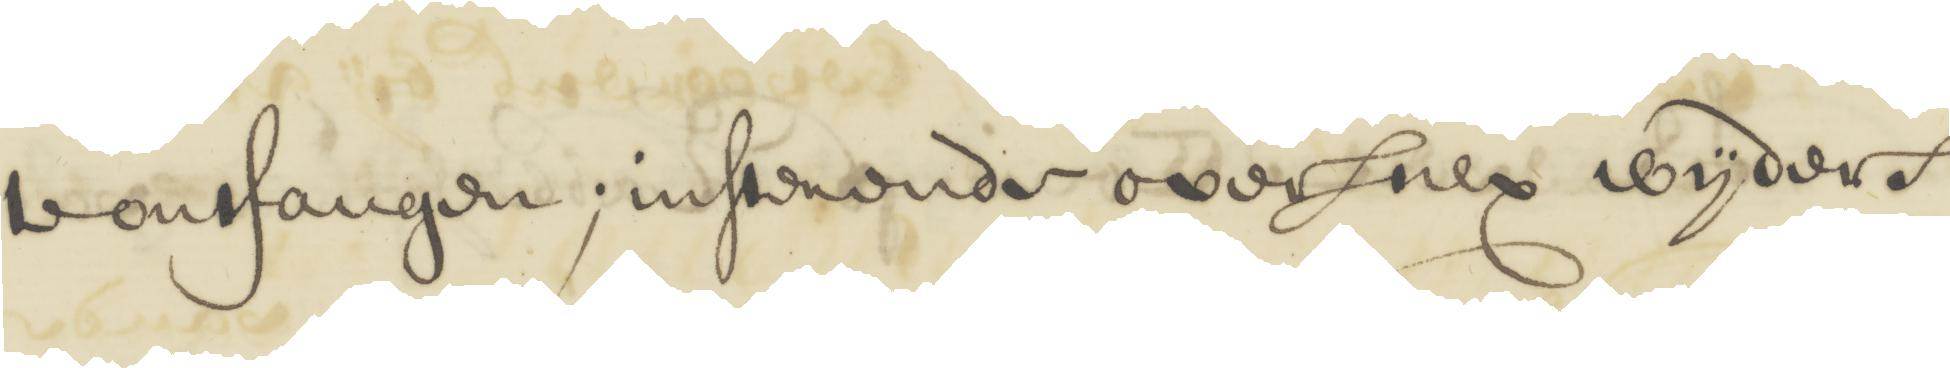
te ontfangen; insterende oversulx wijders
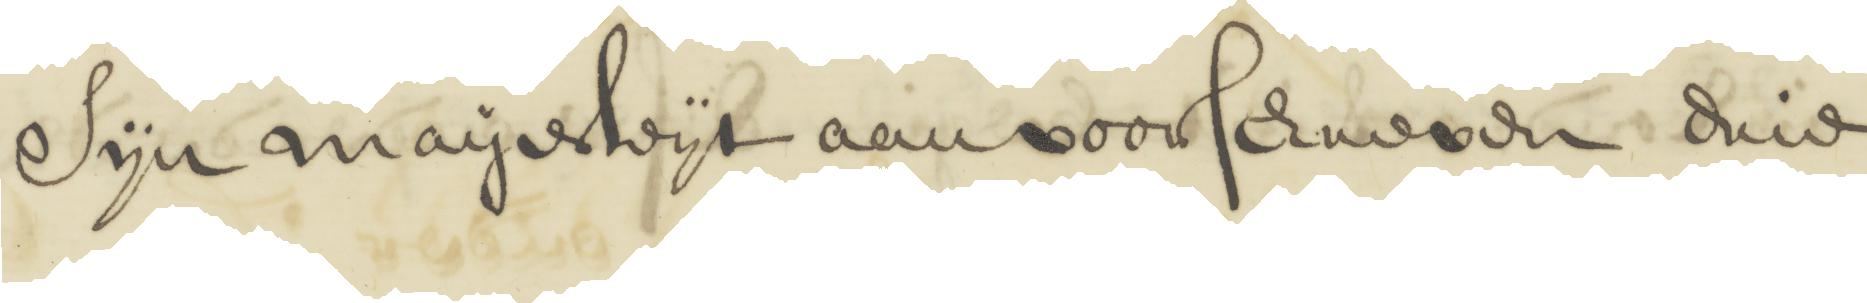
Sijn maijesteijt aan voorschreven drie
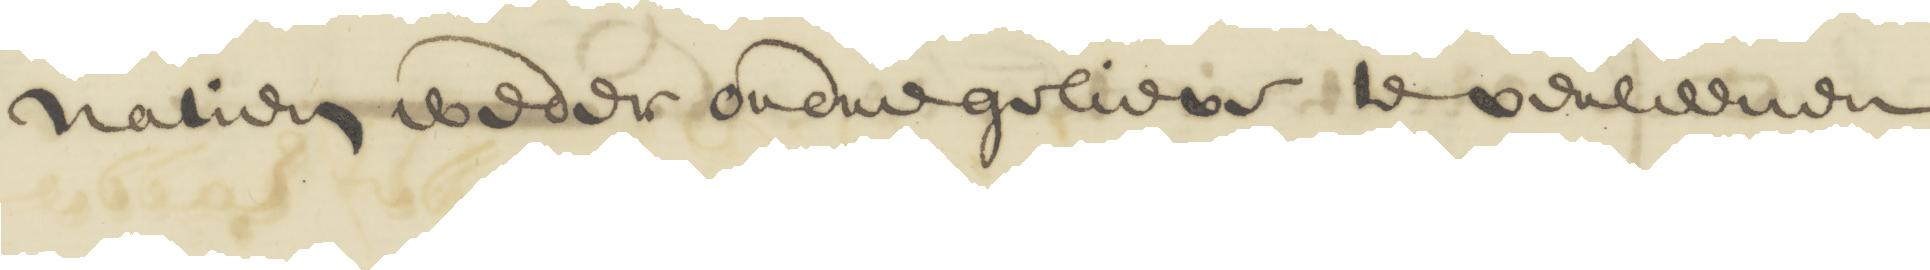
natien weder ordre gelieve te verleenen,
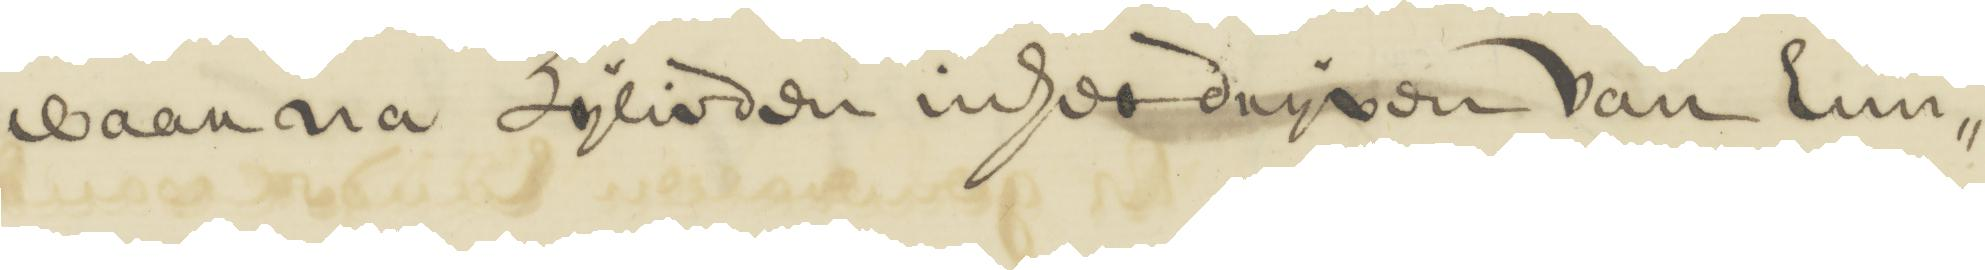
waar na zijlieden inhet drijven van hun„
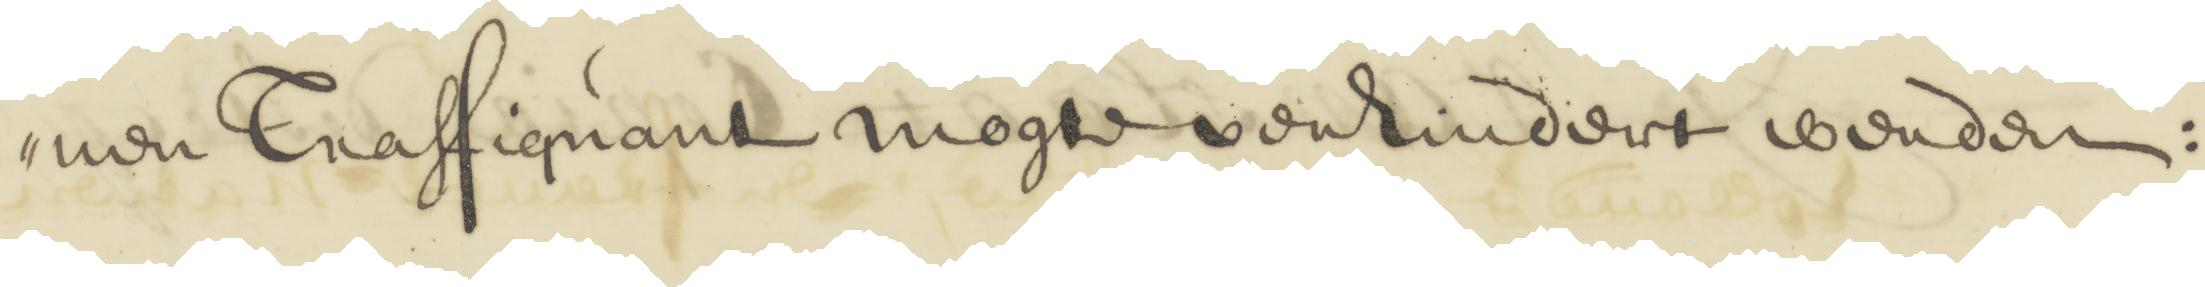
„nen Traffiquant mogte verhindert werden:
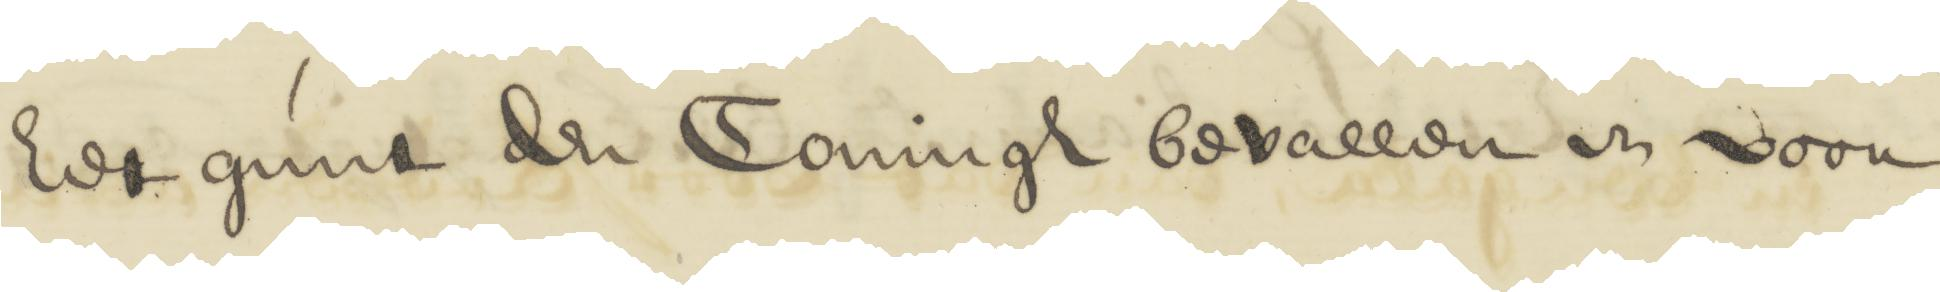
het gunt den Coningh bevallen en voor
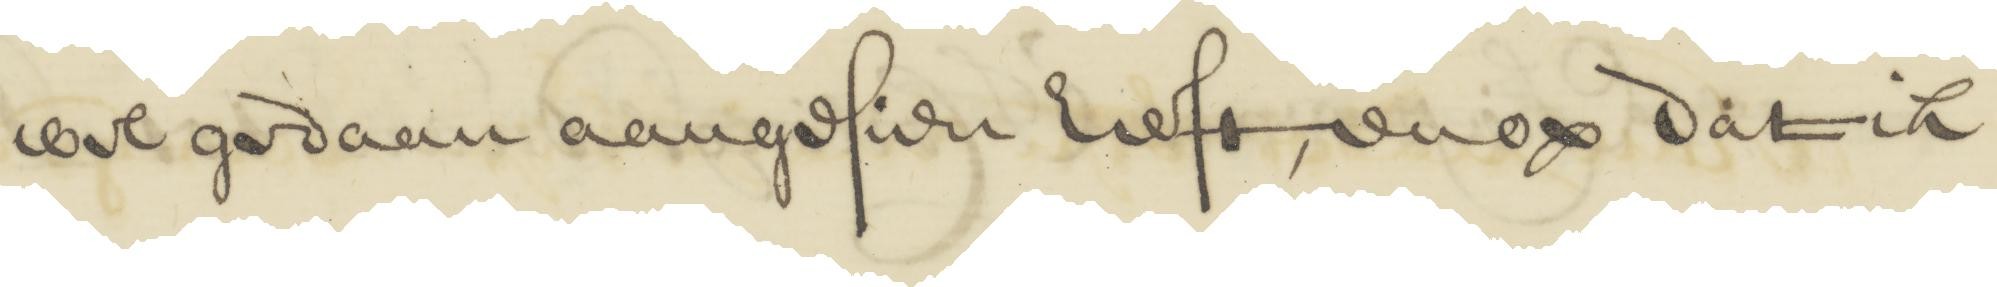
wel gedaan aangesien heeft, en op dat ik
